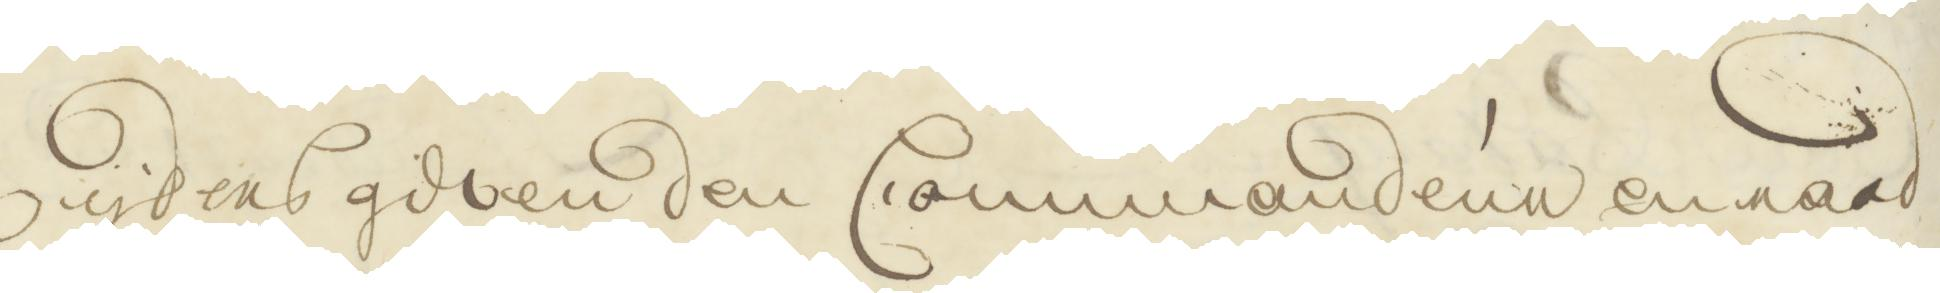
Wijders geven den Commandeur en raad
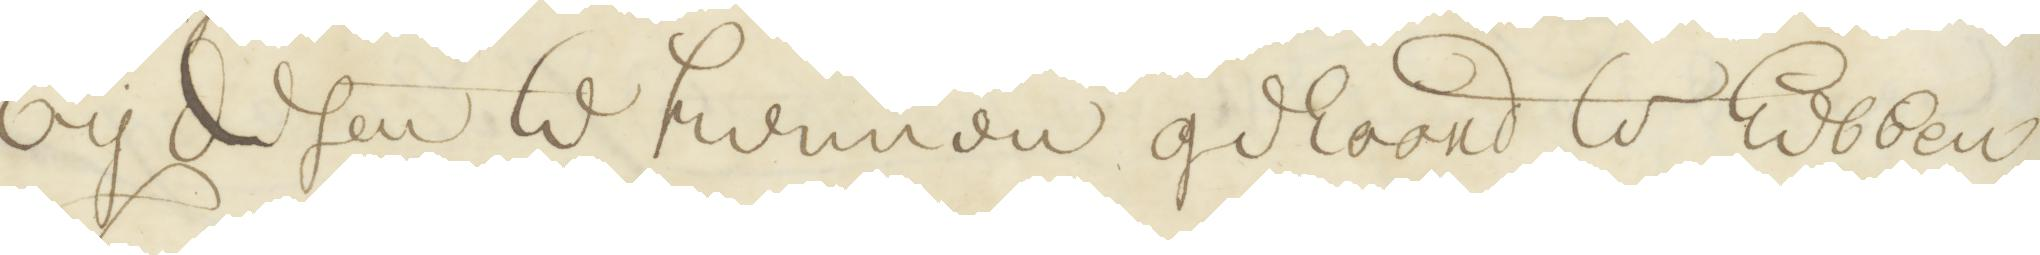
bij desen te kennen gehoord te hebben
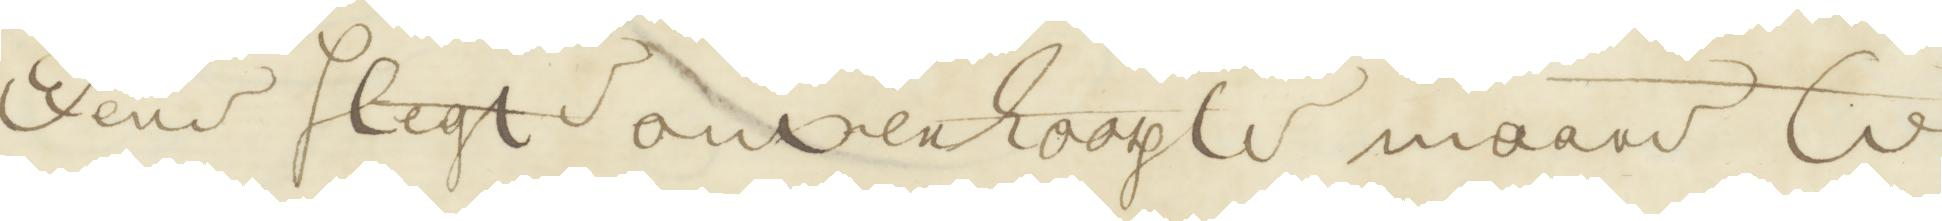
eene slegte onverhoopte maare te
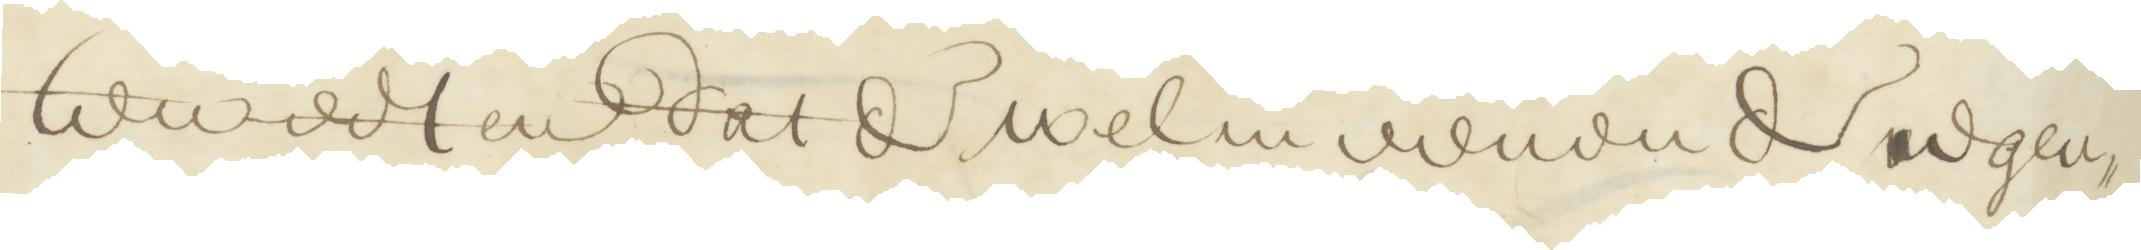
teweeten dat de welmeenende regen„
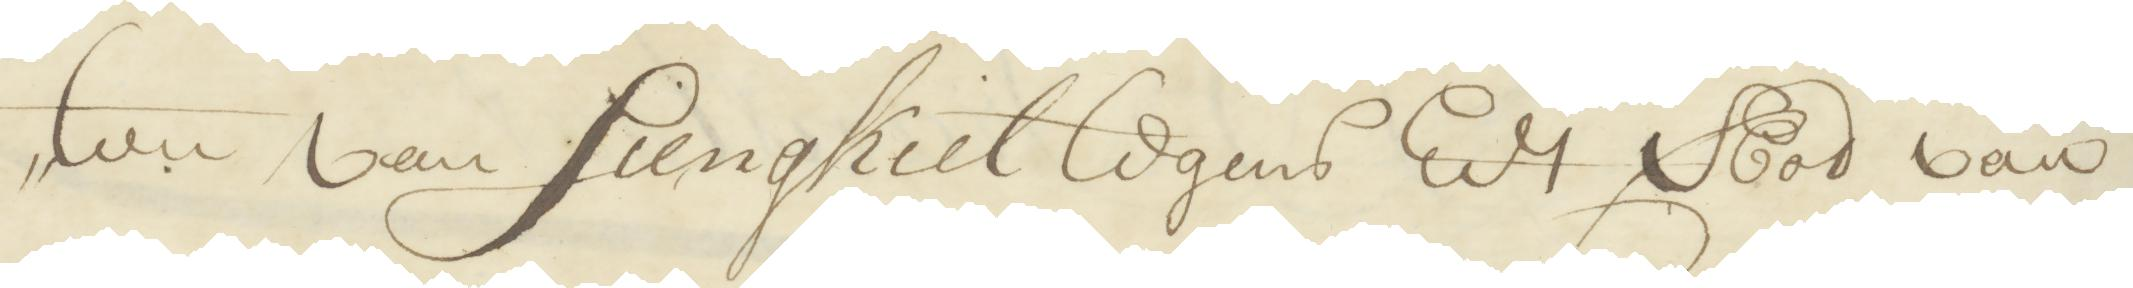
„ten van Siengkiel tegens het verbod van
